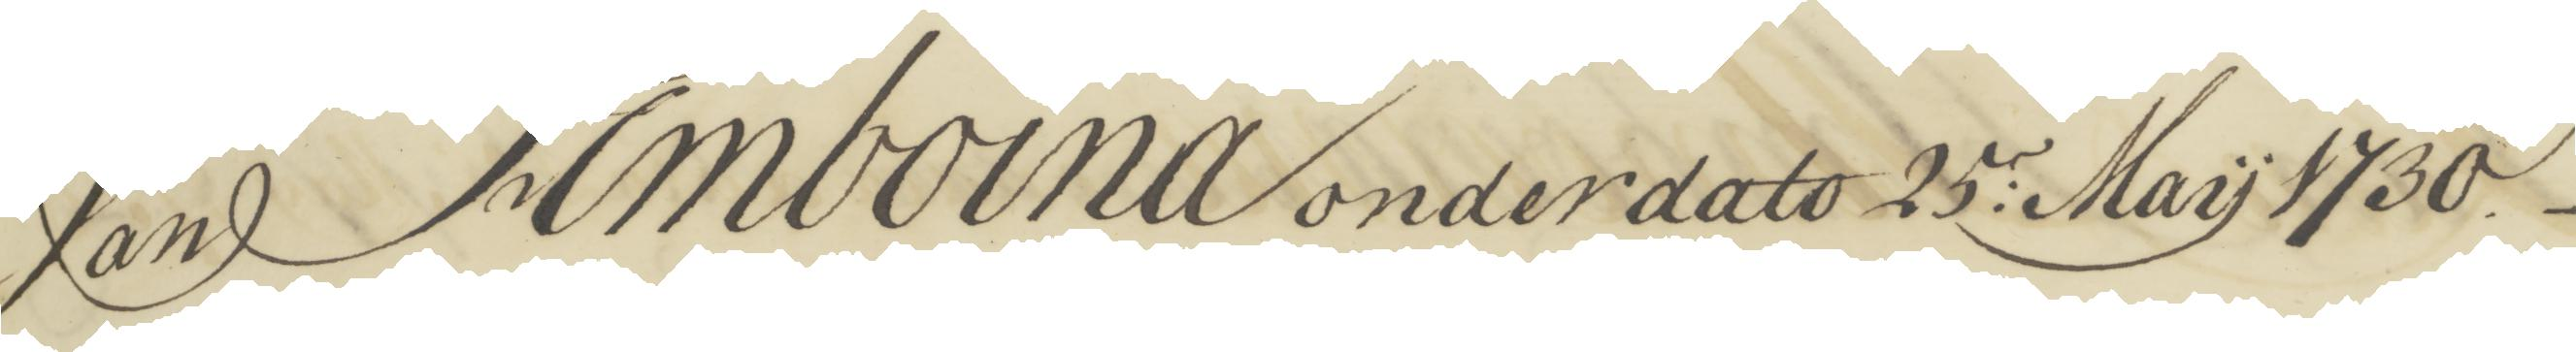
Van Amboina onder dato 25:' Maij 1730._
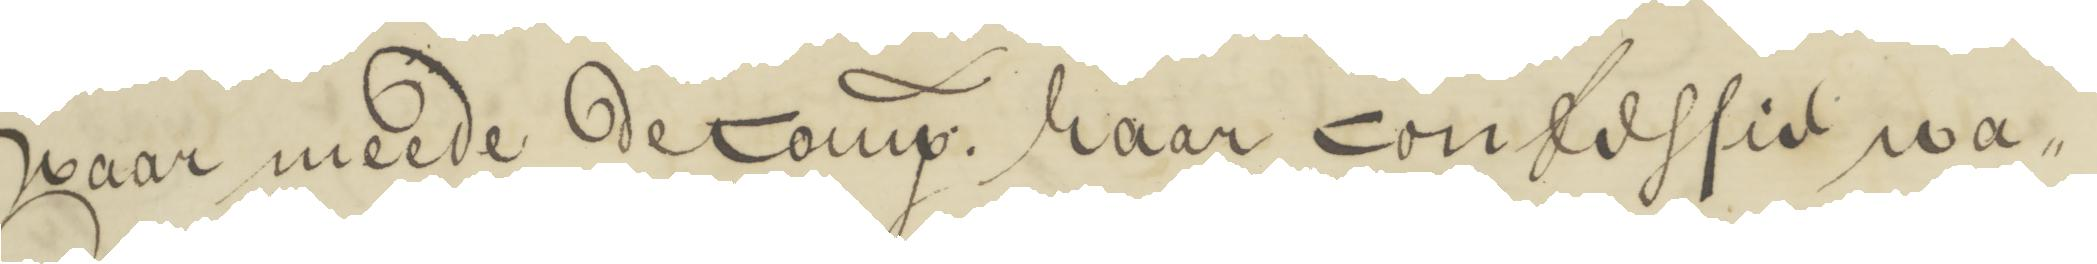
waar meede de comp. haar confessie wa„
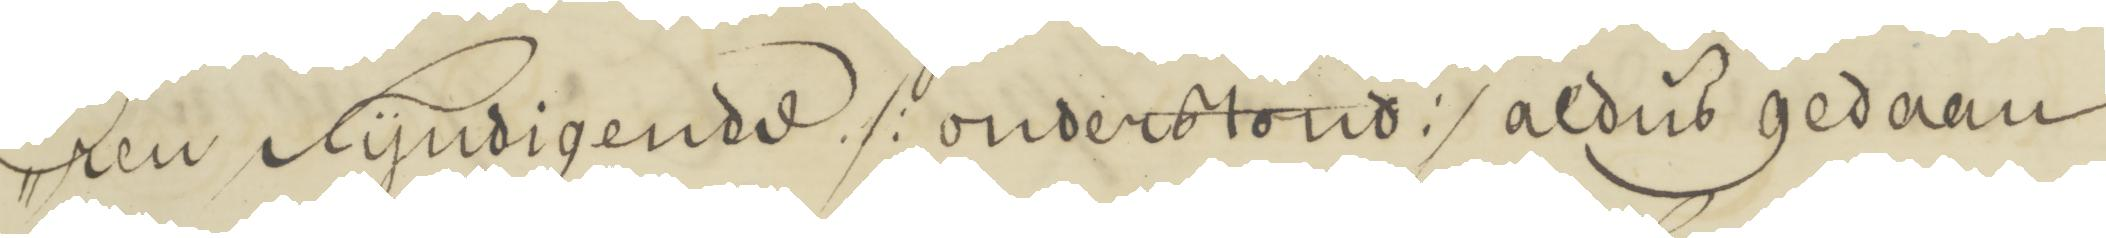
„ren eijndigende /: onderstond:/ aldus gedaan
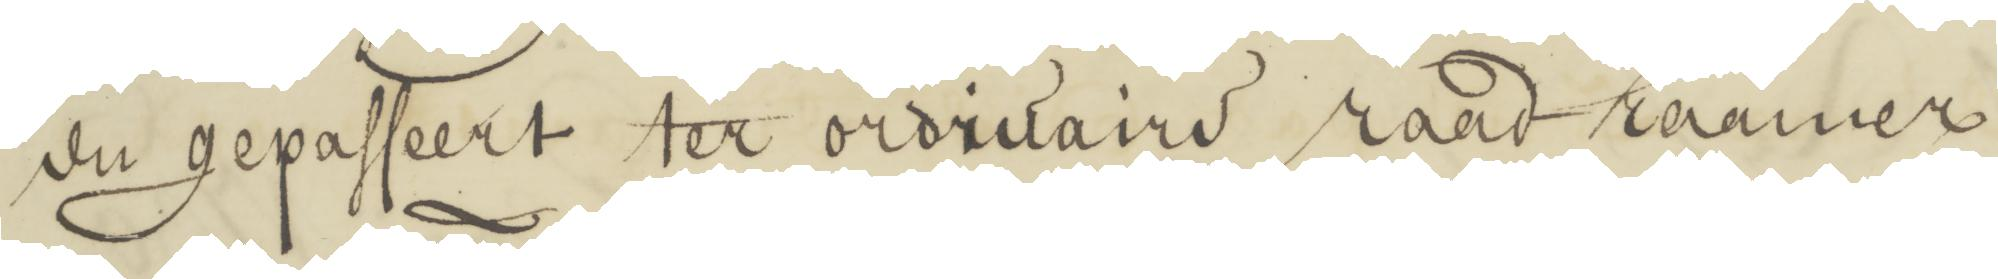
en gepasseert ter ordinaire raad-kaamer
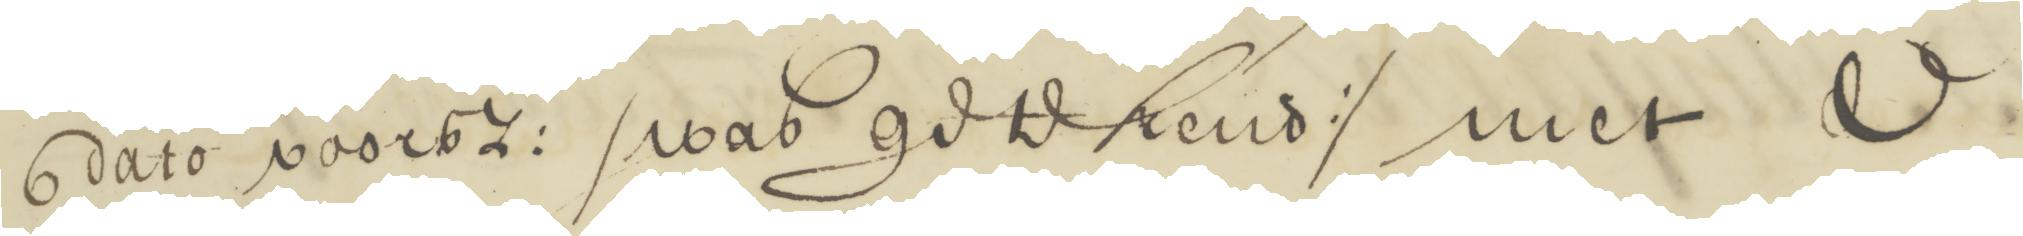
dato voorsz: /was getekend:/ met de
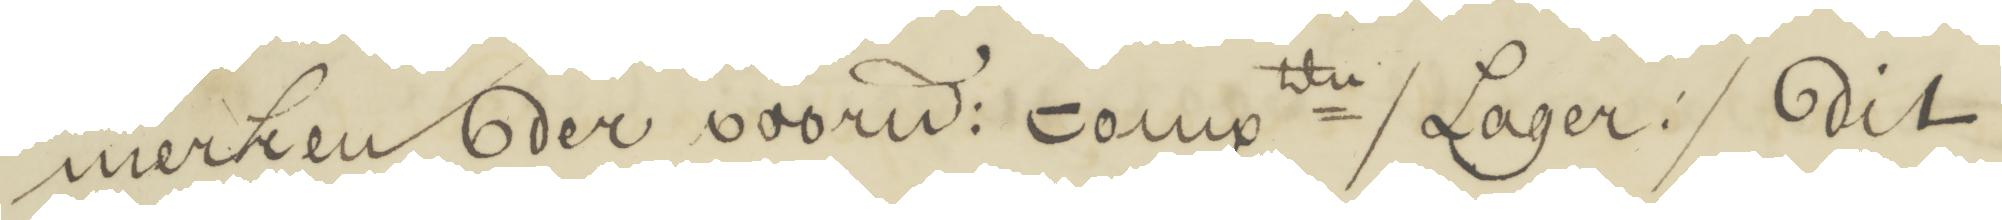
merken der voorn: comp=ten / lager:/ dit
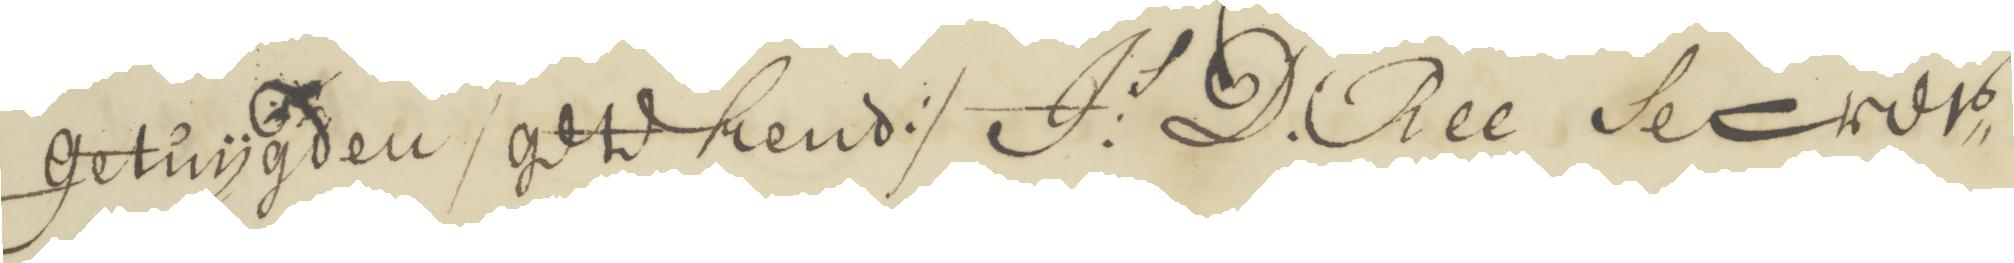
getuijgden /getekend:/ I:s D. Ree secret„s
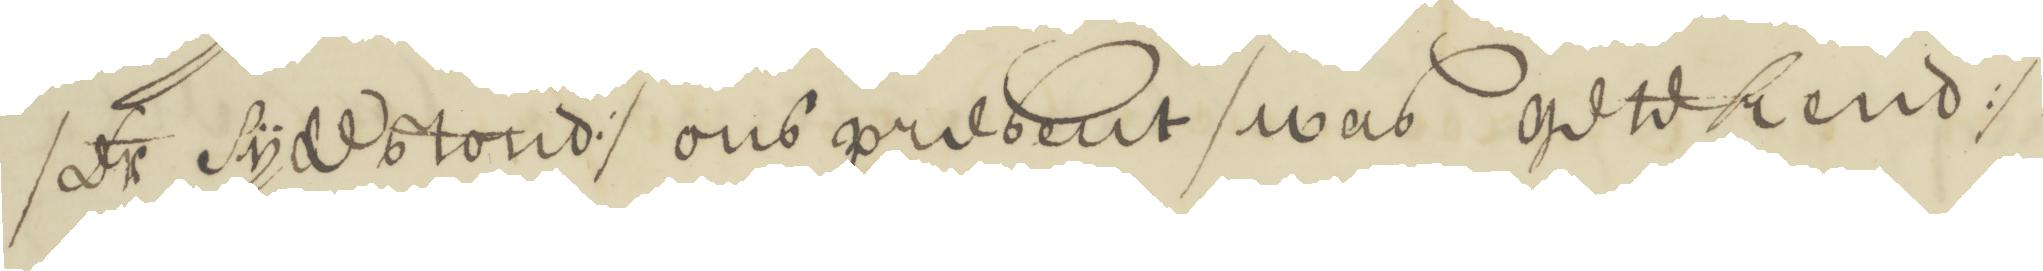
ter sijde stond:/ ons present / was getekend:/
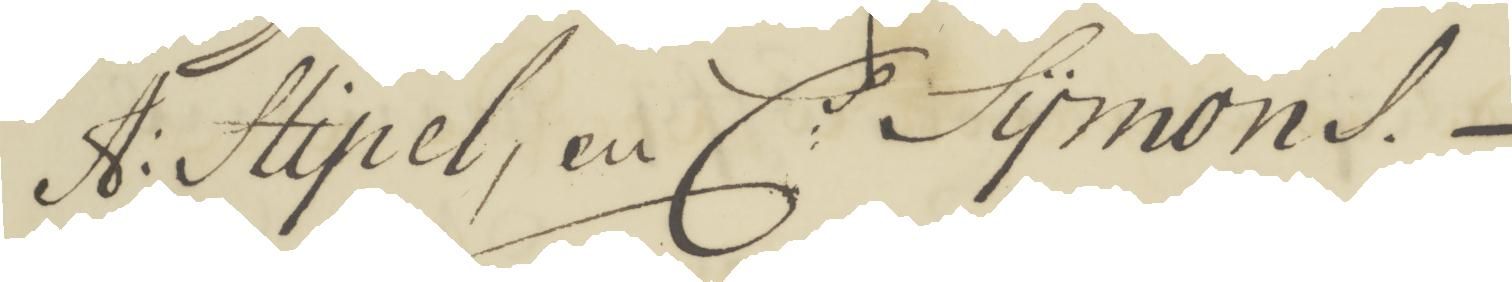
A: Stipel, en C:s Sijmons.—
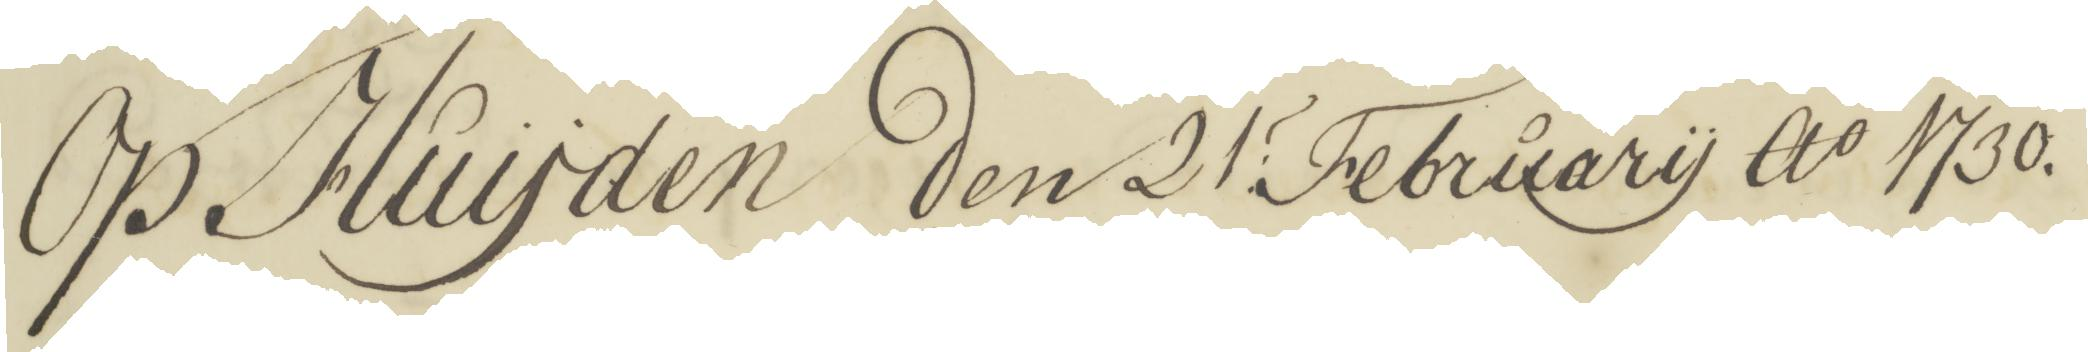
Op Huijden den 21:' Februarij A:o 1730.
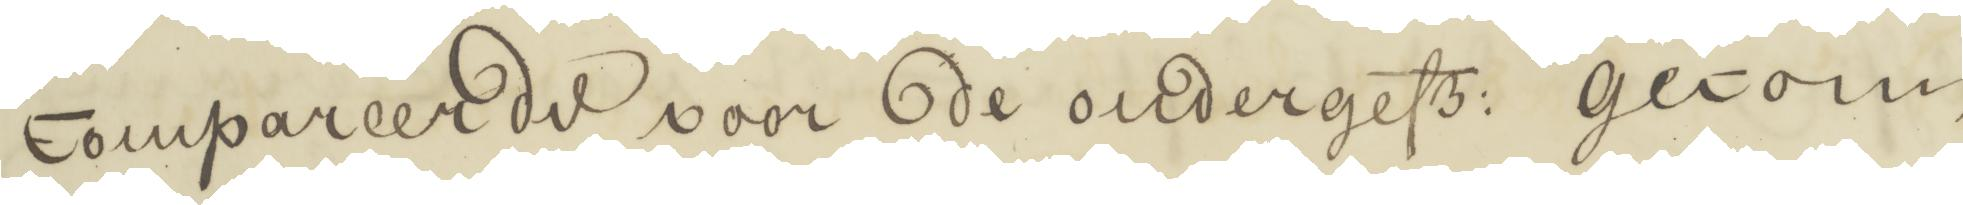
compareerde voor de ondergess: gecom„
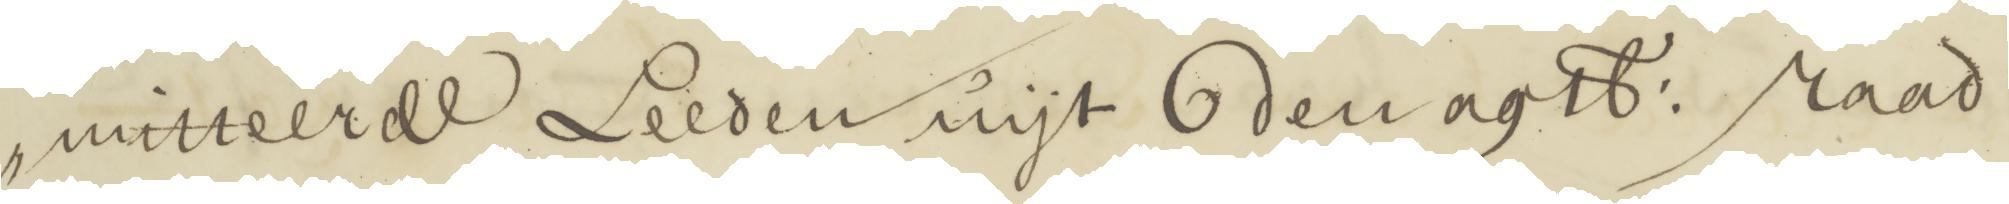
mitteerde leeden uijt den agtb: raad
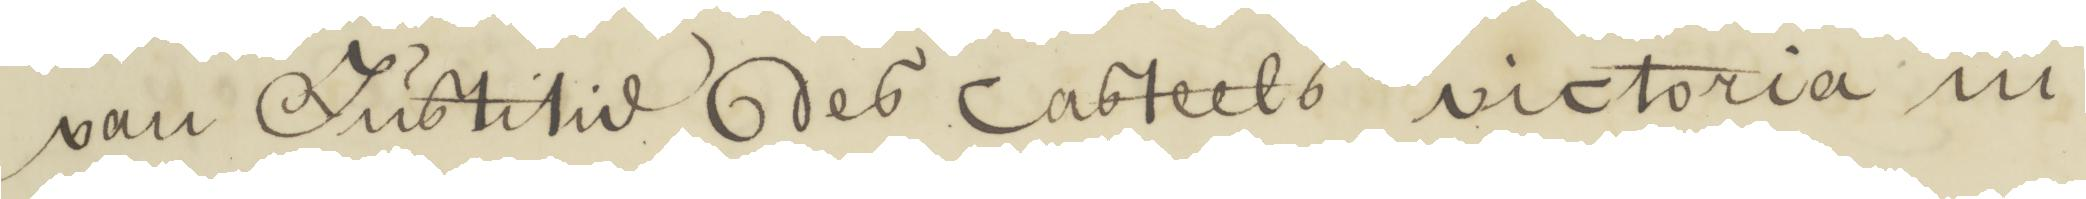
van Iustitie des casteels victoria in
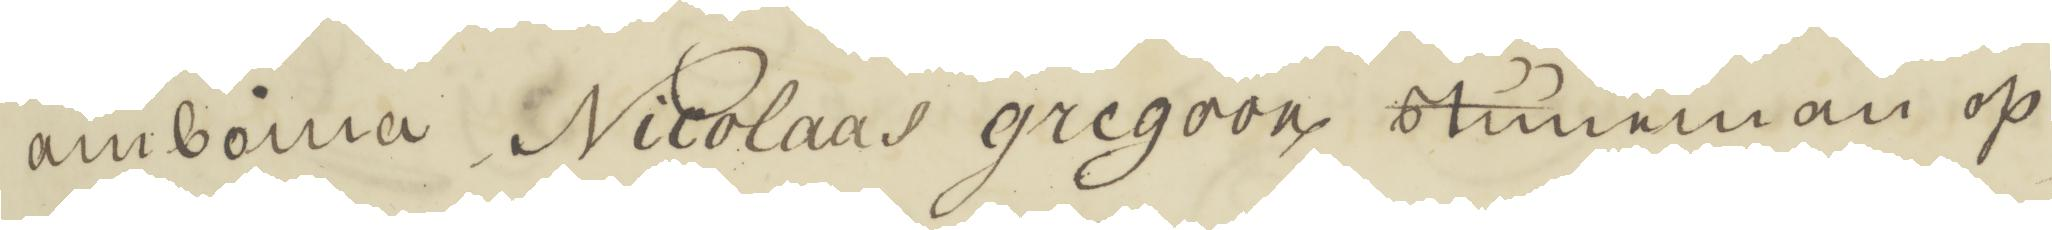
amboiia Nicolaas gregoor stuurman op
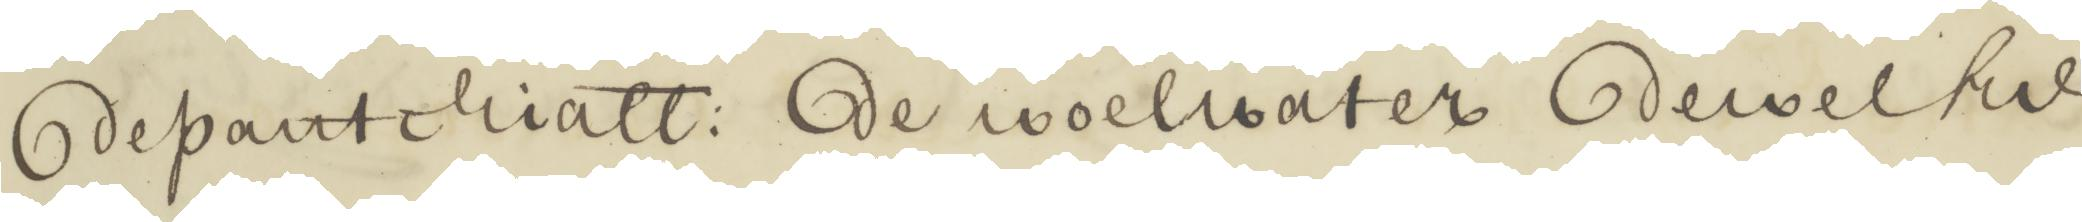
de pantchiall: de woelwater dewelke
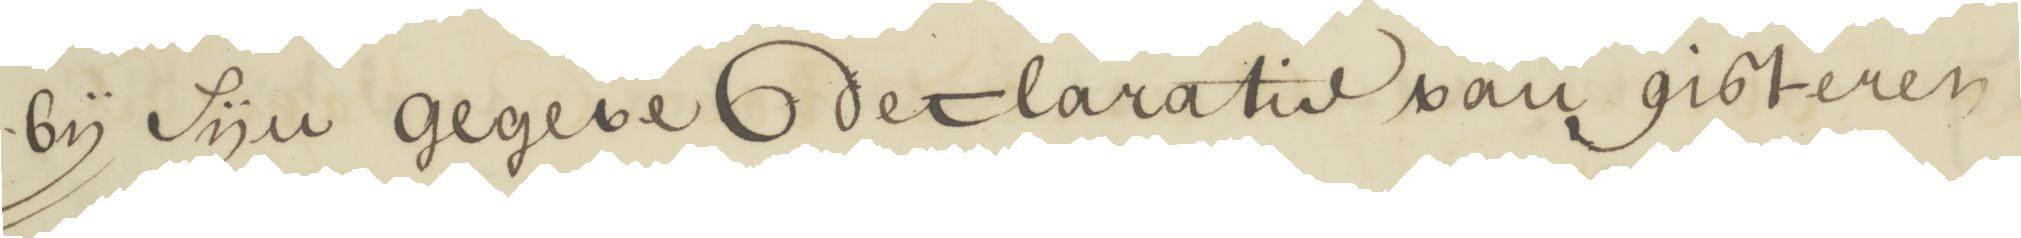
bij sijn gegeve declaratie van gisteren
